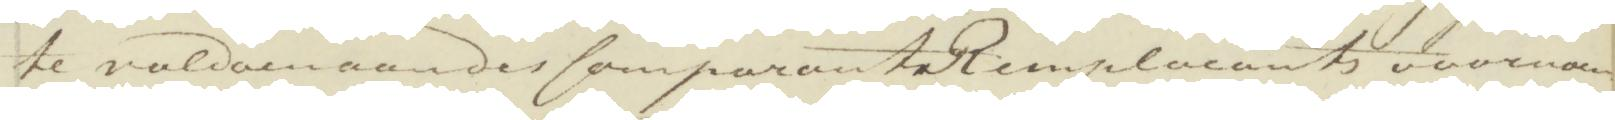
te voldoen aan des Comparant Remplacants voornoe
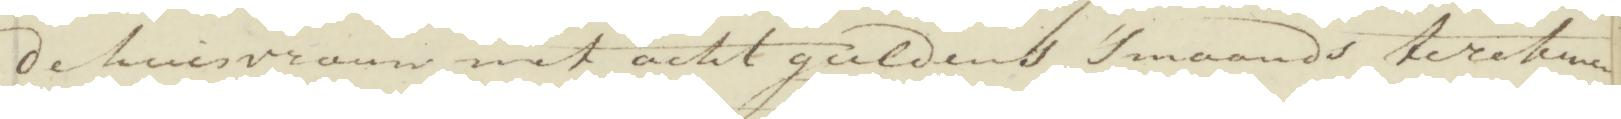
de huisvrouw met acht guldens 'smaands te rekenen
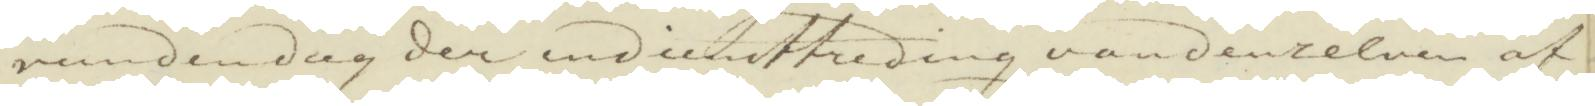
van den dag der indiensttreding van denzelven af
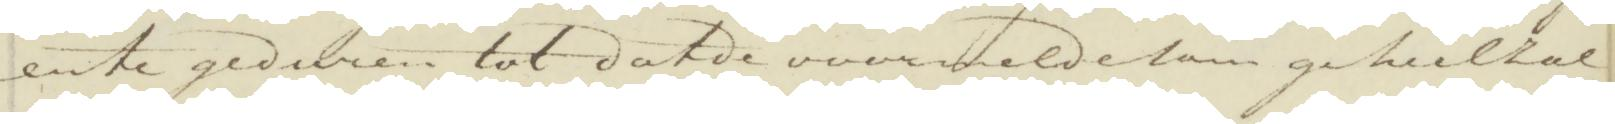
ente geduren tot dat de voormeldesom geheelzal
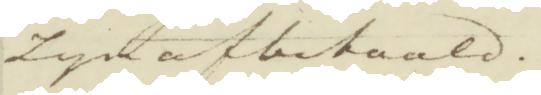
zyn afbetaald.
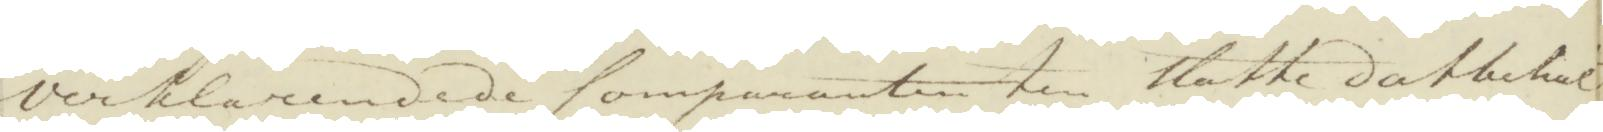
Verklarendede Comparanten ten slotte dat behal
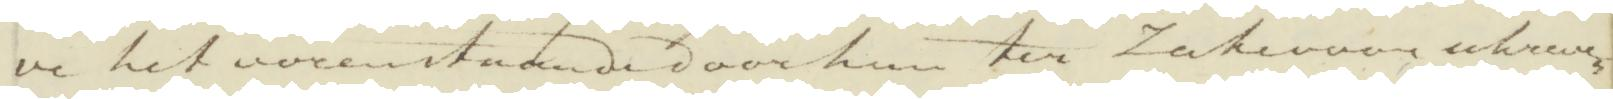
ve het vorenstaande door hun ter zakevoorschreven
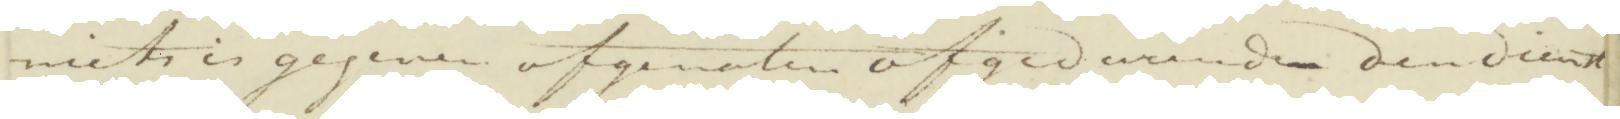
niets is gegeven ofgenoten of gedurenden den dienst
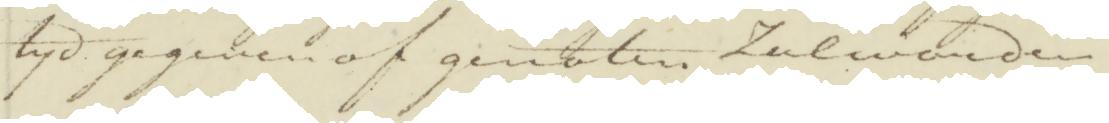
tijd gegeven of genoten zal worden
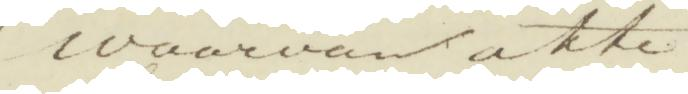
waarvan akte
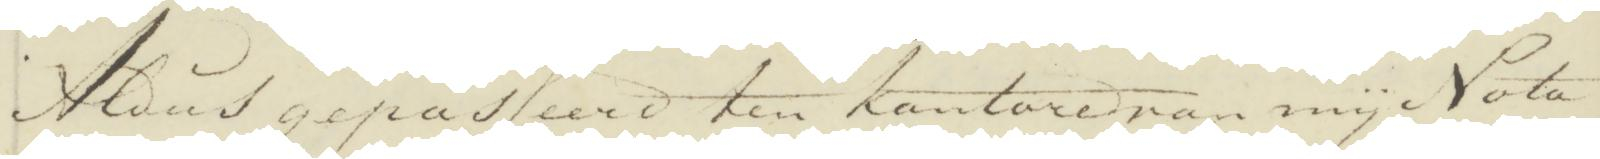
Aldus gepasseerd ten kantore van mij Nota
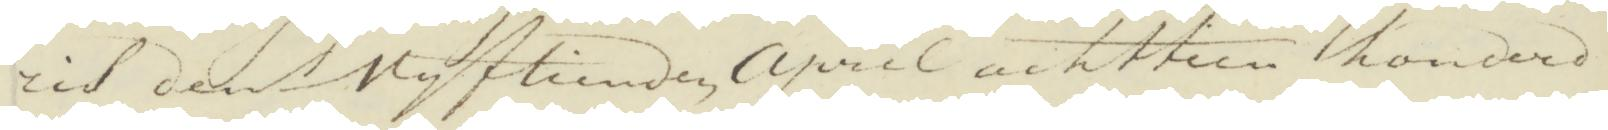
ris den Vyftienden April achttien honderd
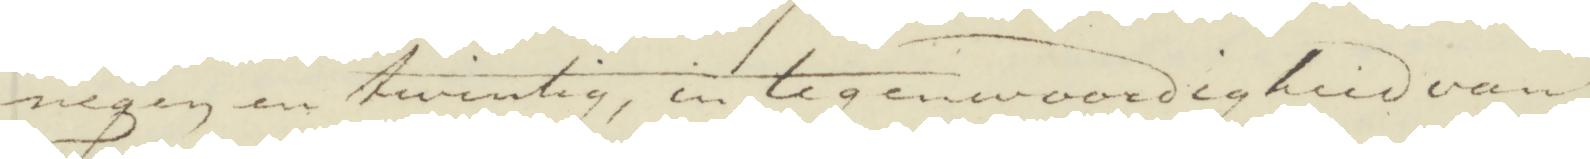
negen en twintig, en tegenwoordigheid van
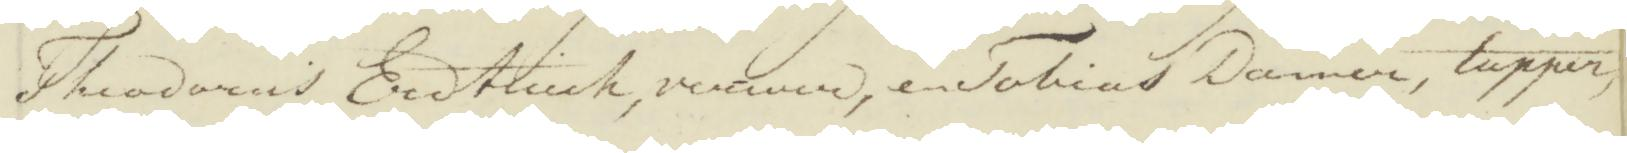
Theodorus Erdtsieck, verwer, en Tobias Damer, tapper,
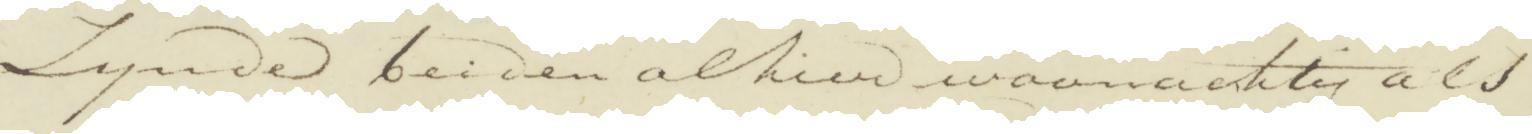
Zynde beiden alhier woonachtig als
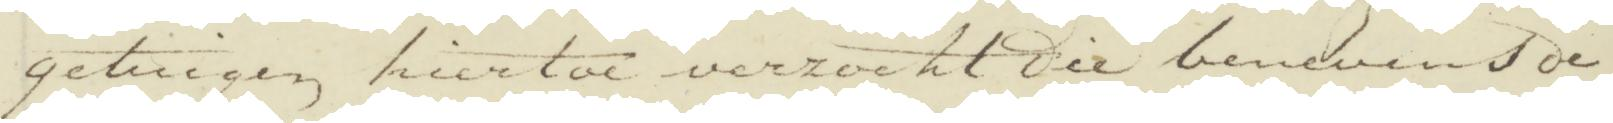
getuigen hiertoe verzocht die benevens de
